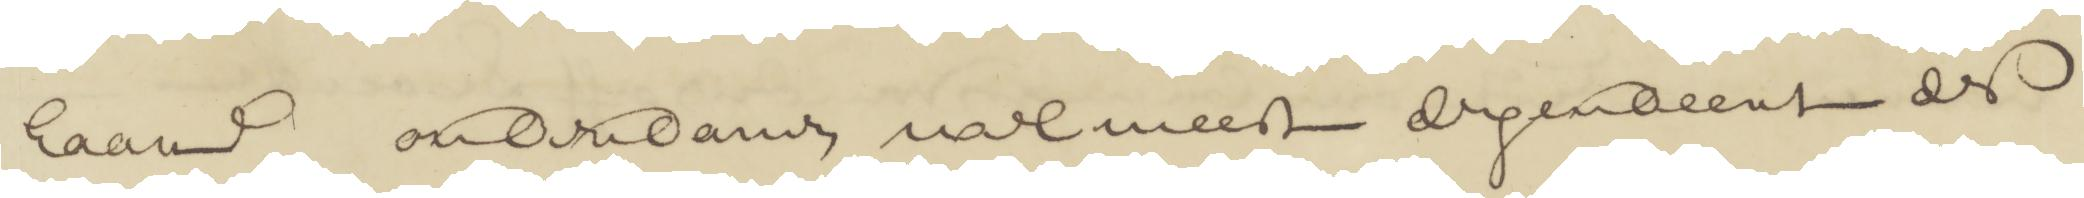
haare onderdanen wel meest dependeert des
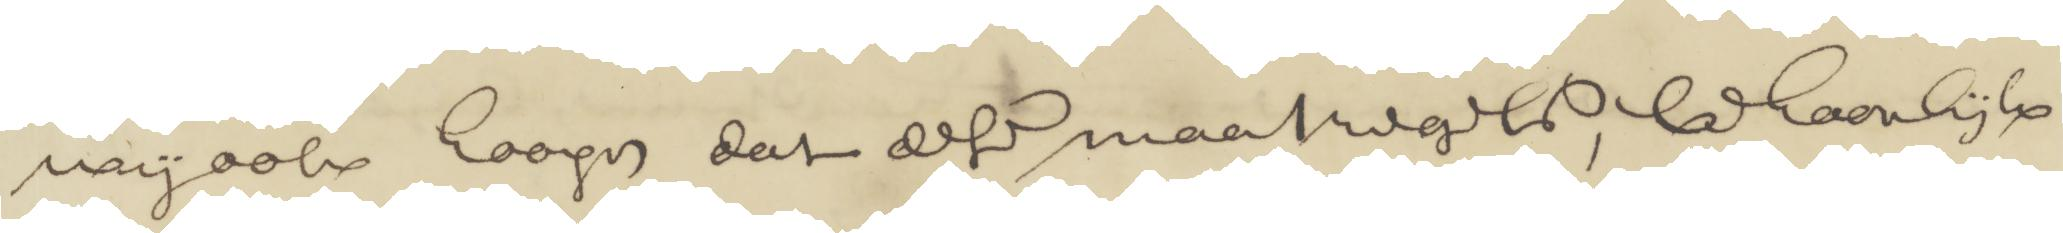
wij ook hoopen dat dese maatregels, behoorlijk
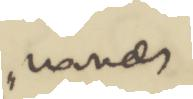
„worden
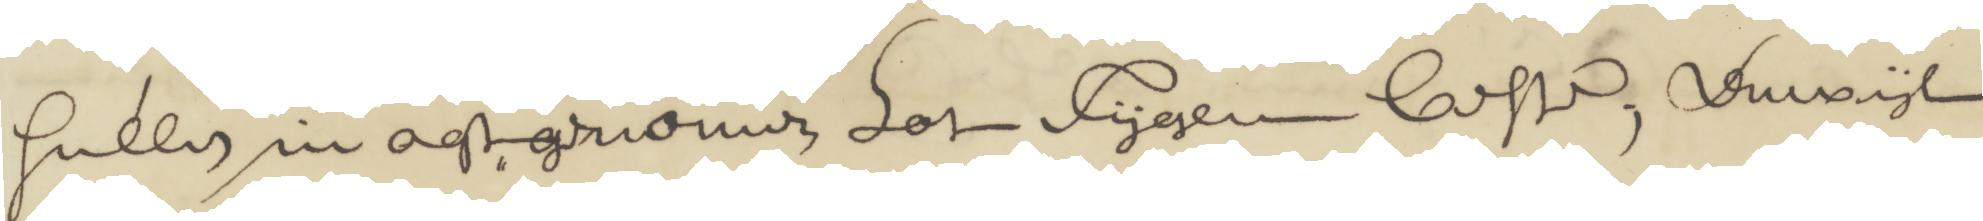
sullen in agt„ genomen tot Eijgen beste, verwijl
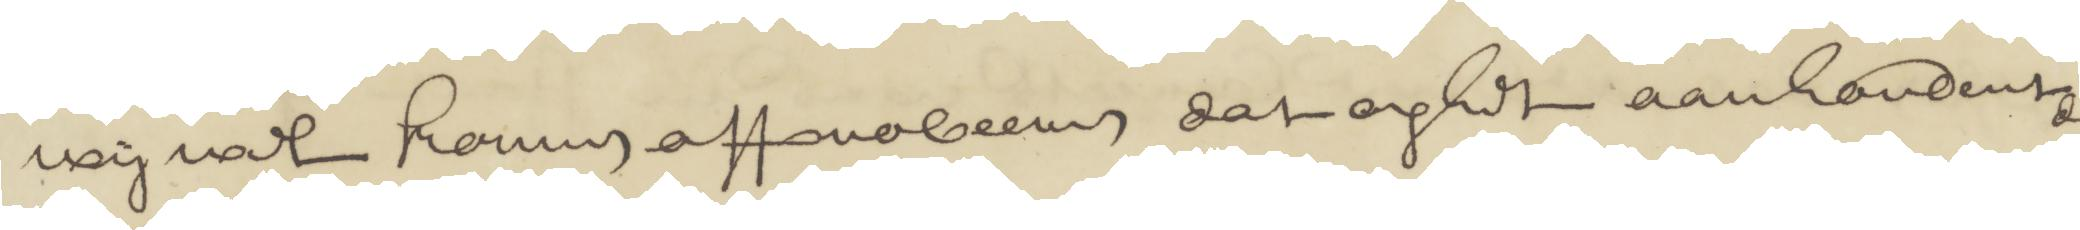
wij wel konnen approbeeren dat op het aanhoudent
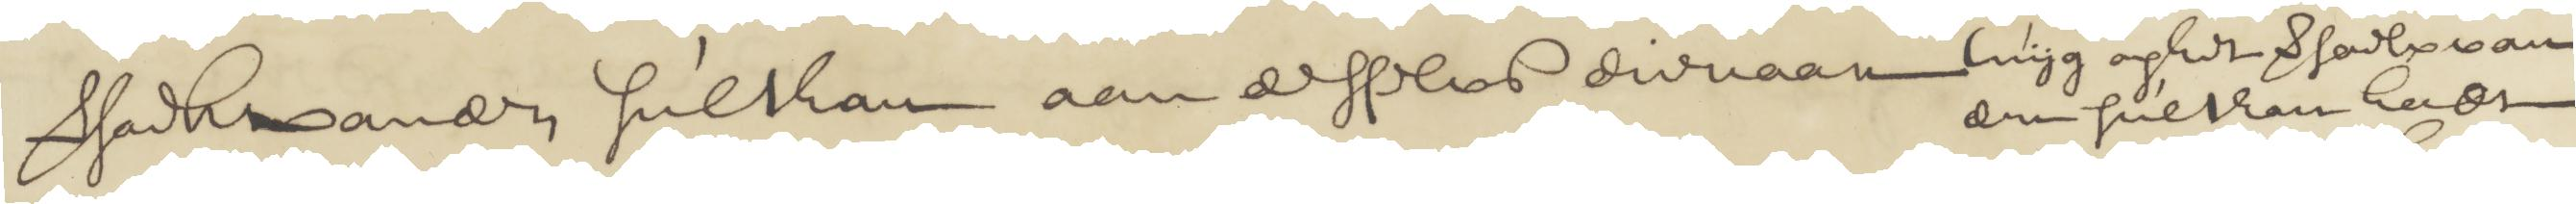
versoek van den sulthan aan desselvs dienaar tuijg op het verhael van
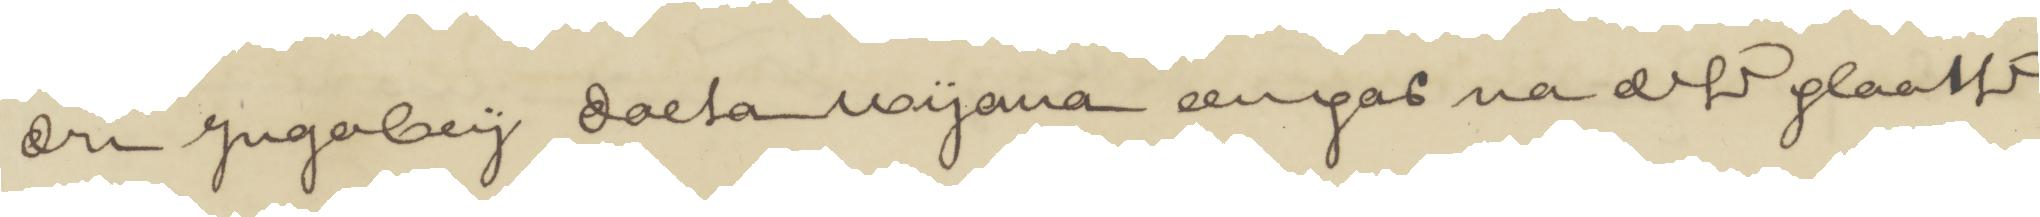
den jngabeij doeta wijana een pas na dese plaatse
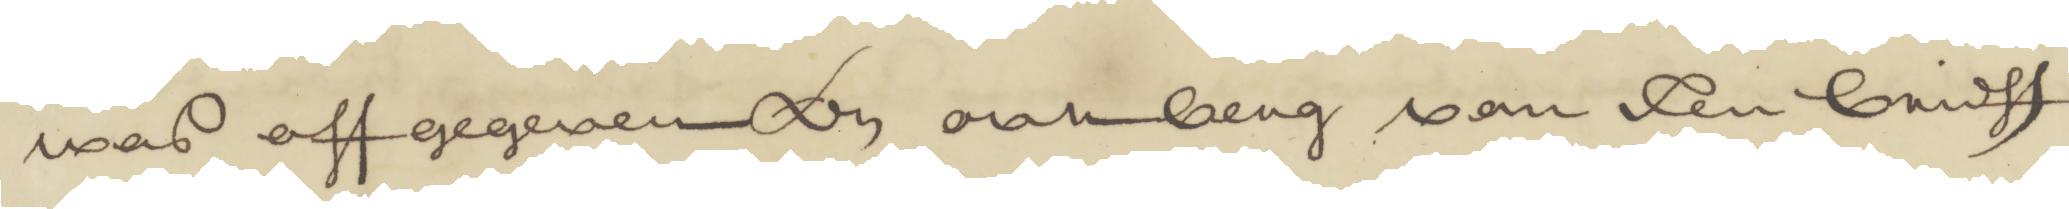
was aff gegeven ten overberg van Een brieff
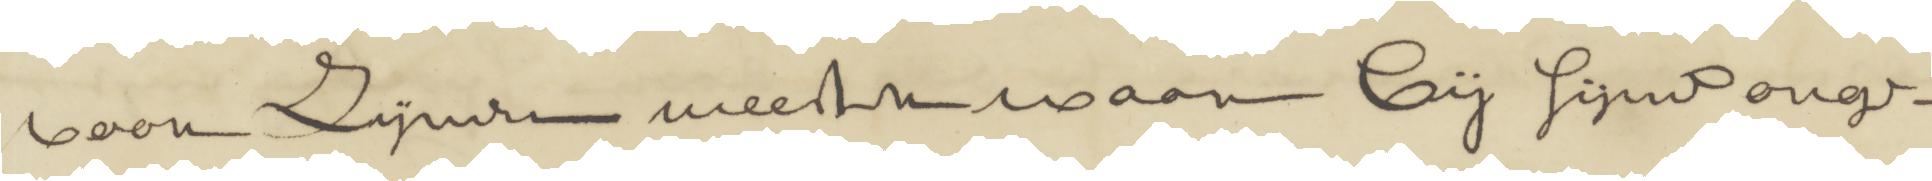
voor Zijnen meester waar bij sijne onge
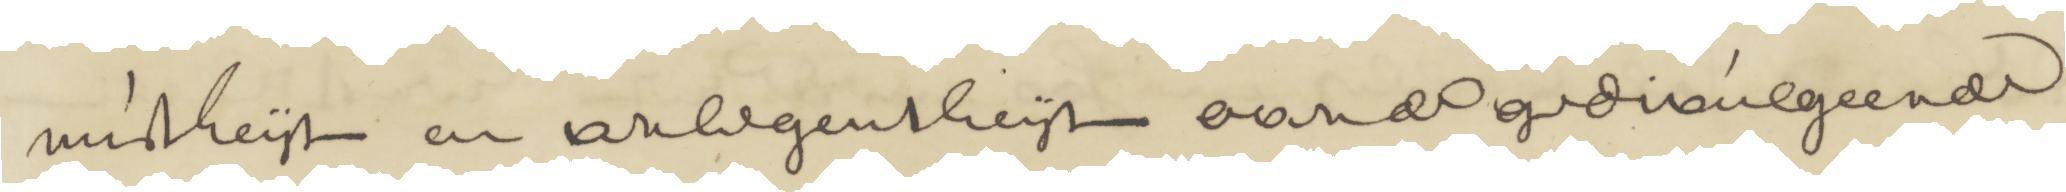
rustheijt en verlegentheijt over de gedivulgeerde
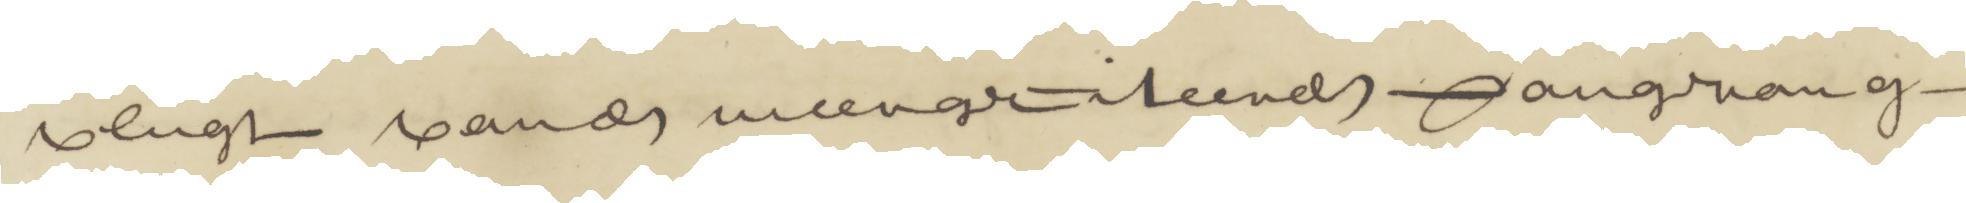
vlugt vanden meergeciteerden pangenang
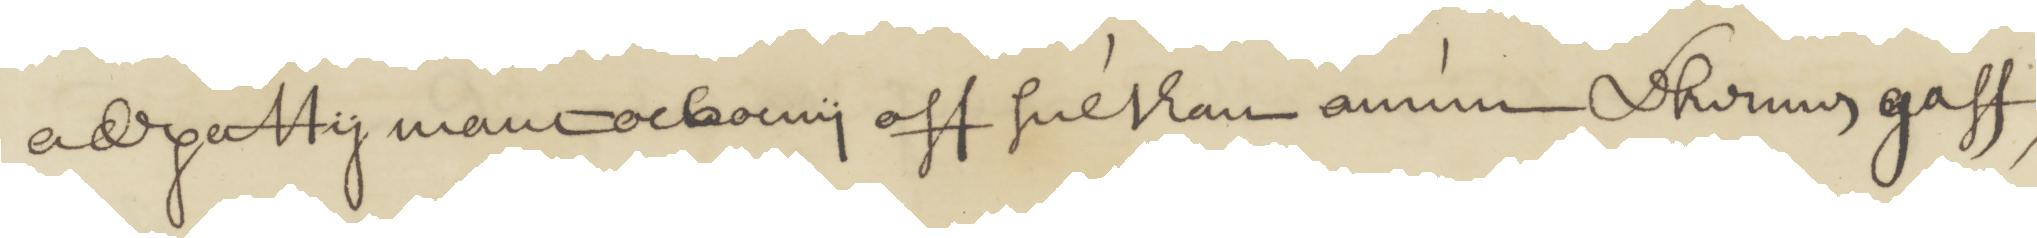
ende pattij mancoeboenij off sulthan anum tekennen gaff,
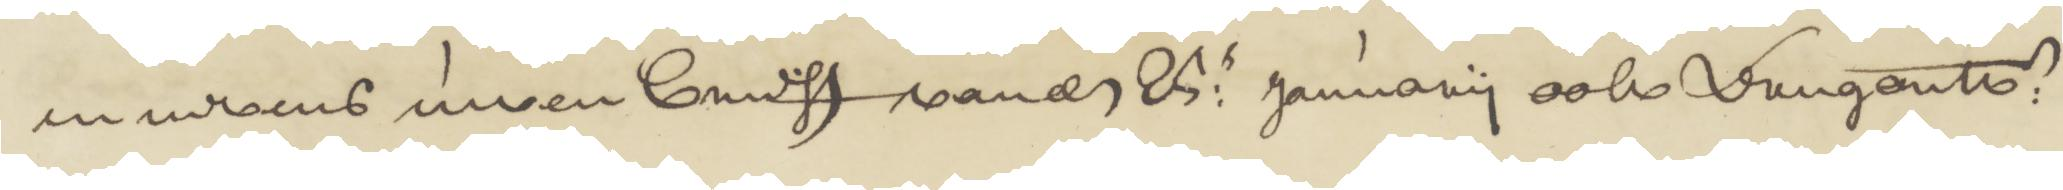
en nevens uwen brieff van den 25:e Januarij ook terngants:
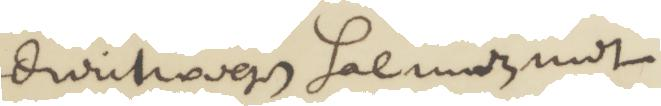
dientwegen sal men met
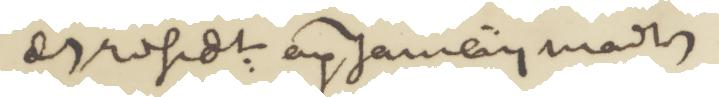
den resid:t op Jambij moeten
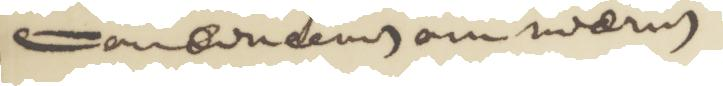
confereeren om reden
